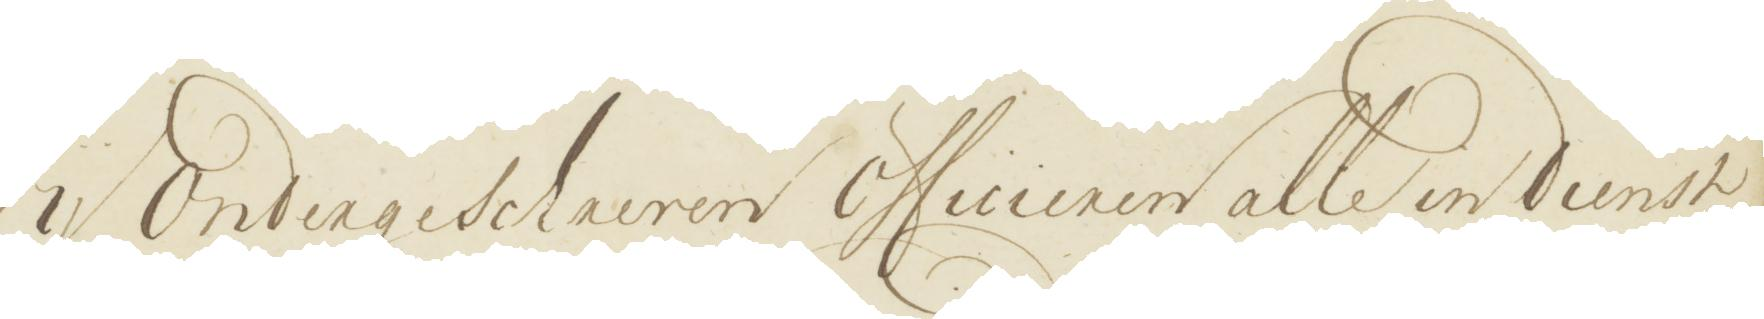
ij ondergeschreven officieren alle in dienst
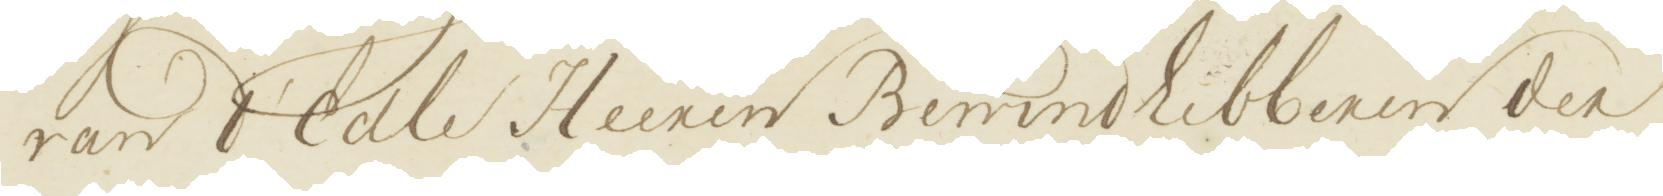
van ’t Edle Heeren Bewind hebberen der
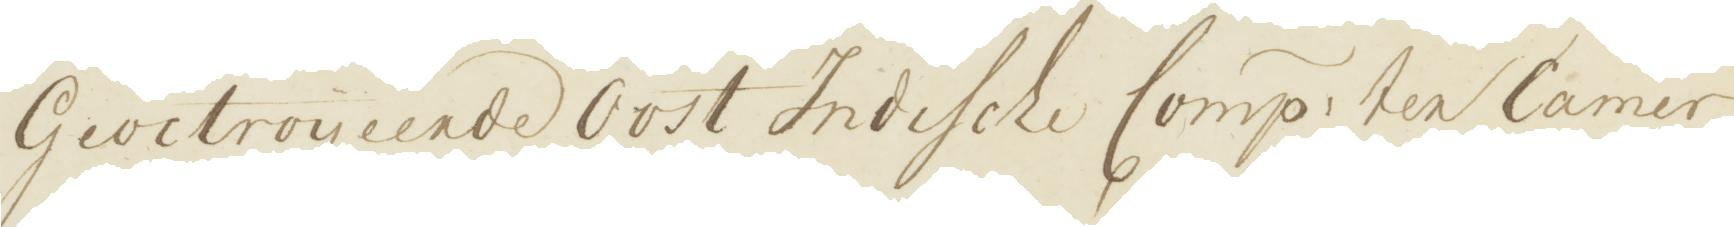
Geoctroijeerde Oost Indische Comp: ter Camer
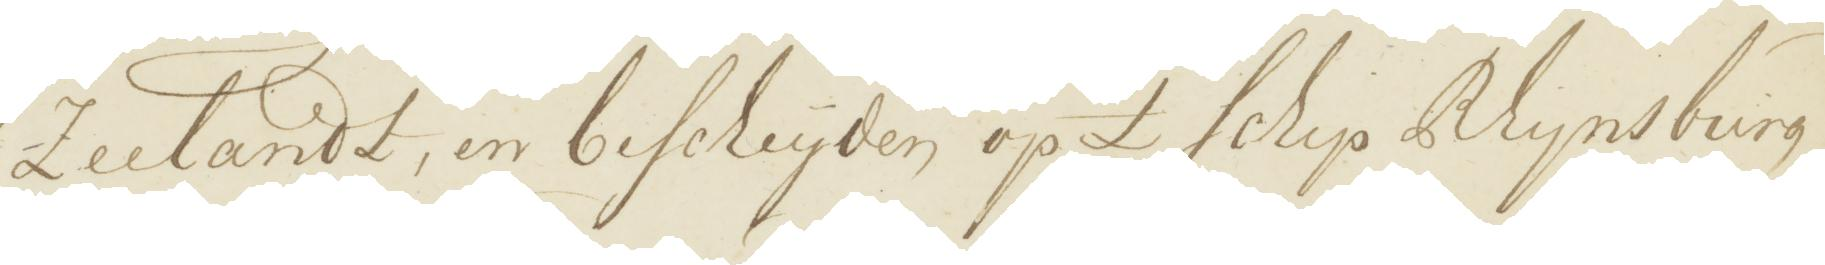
Zeelandt, en bescheijden op ’t schip Rhijnsburg
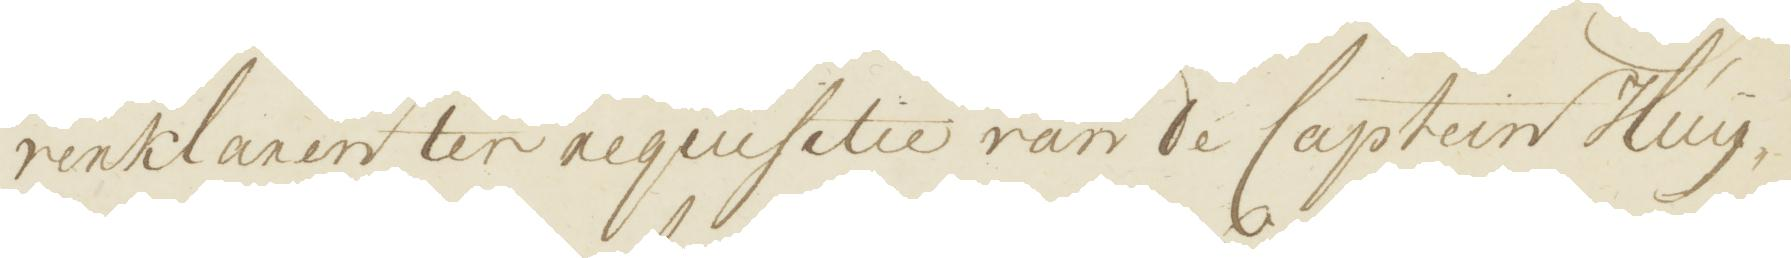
verklaren ter requisitie van de Captein Huij„
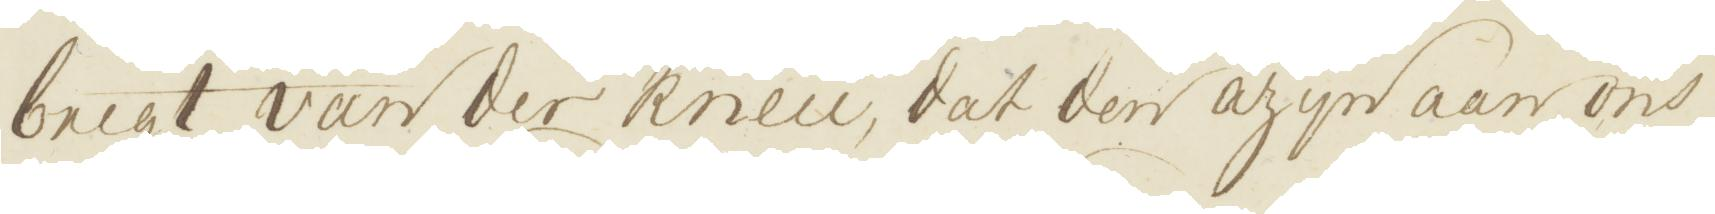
bregt van der kneu, dat den azijn aan ons
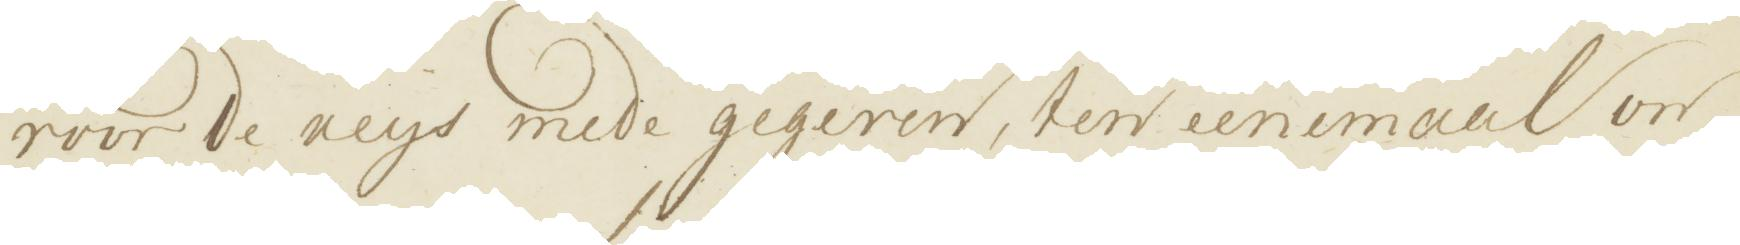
voor de reijs mede gegeven, ten eenemaal on
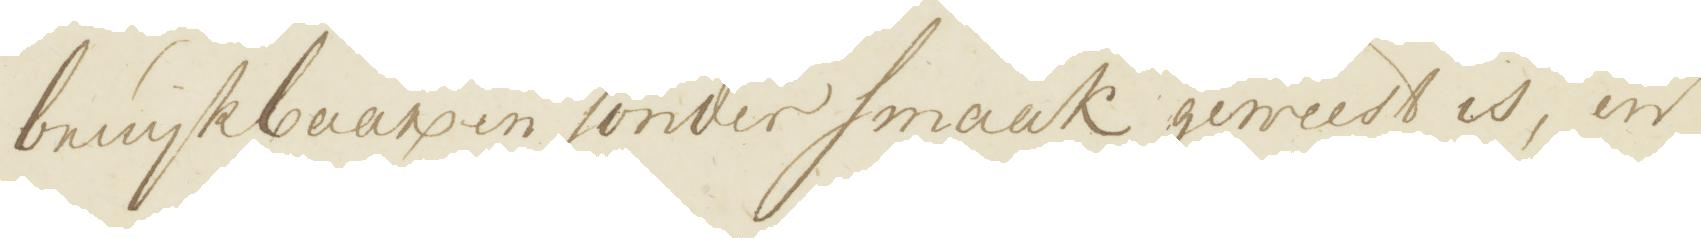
bruijkbaar en sonder smaak geweest is, en
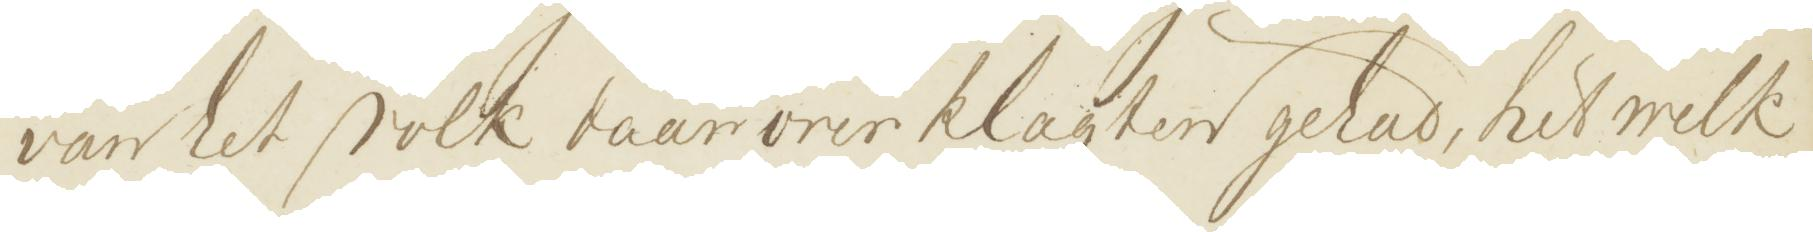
van het volk daar over klagten gehad, het welk
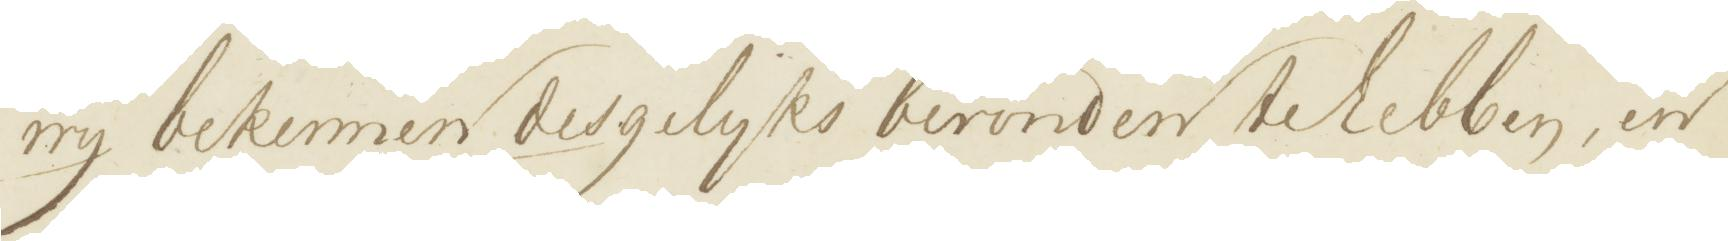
wij bekennen desgelijks bevonden te hebben, en
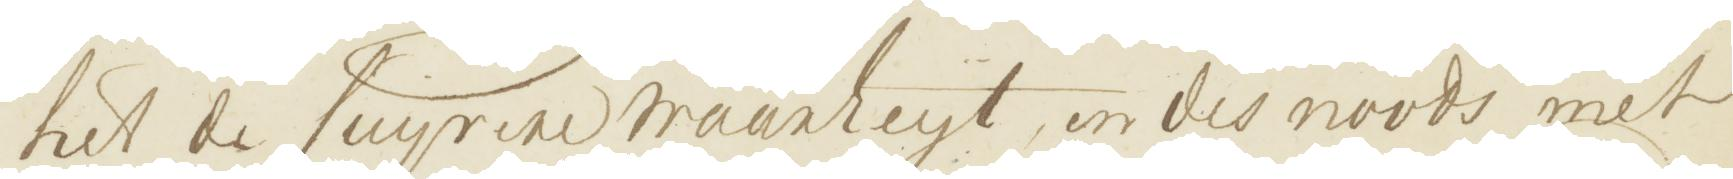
het de suijvere waarheijt, en des noods met
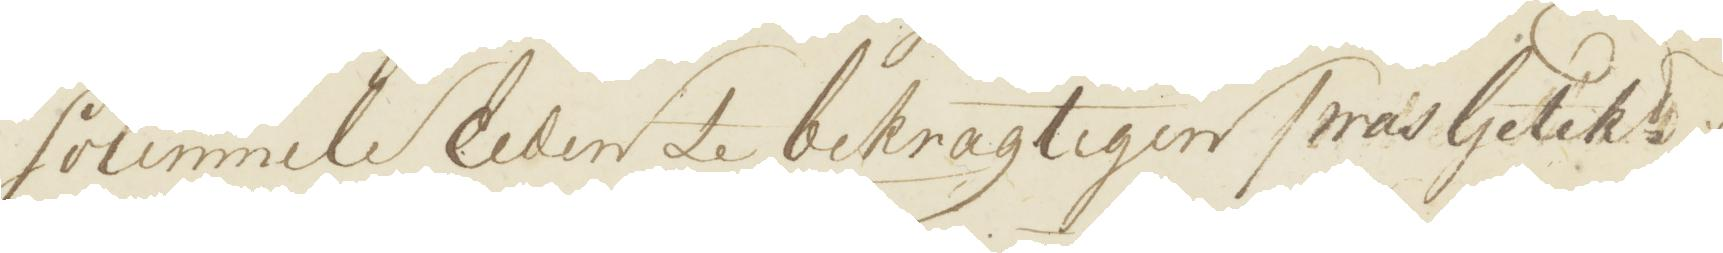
solemnele Eeden te bekragtigen /was Getek=d/
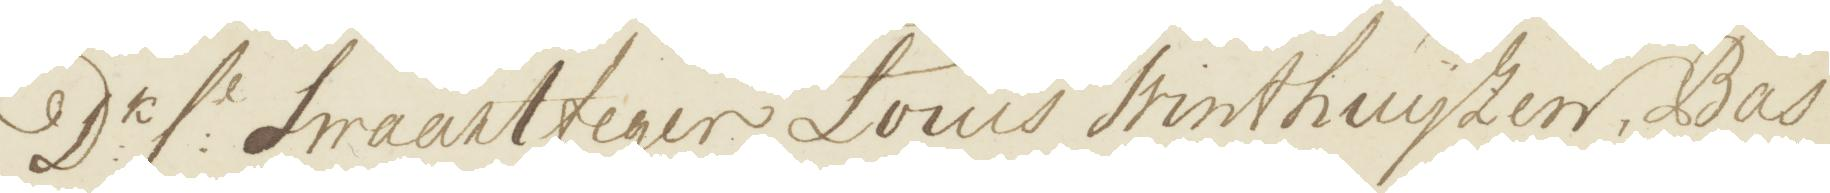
D:k C:l Swaartfeger, Louis Winthuijzen, Bas
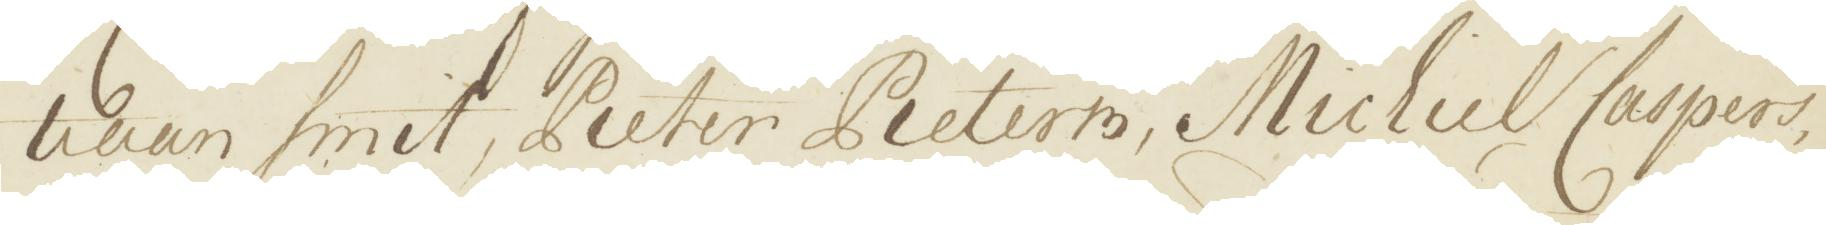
tiaan Smit, Pieter Pietersz, Michiel Caspers,
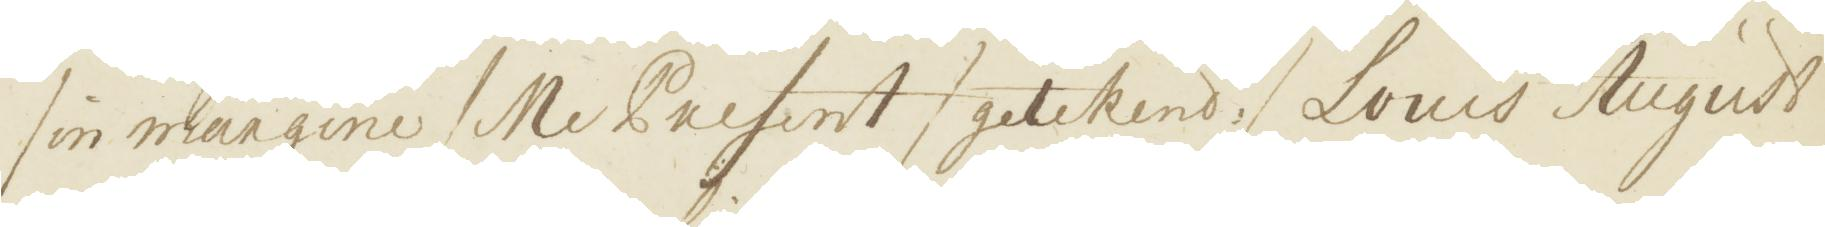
/in margine / Me Present / getekend: / Louis August
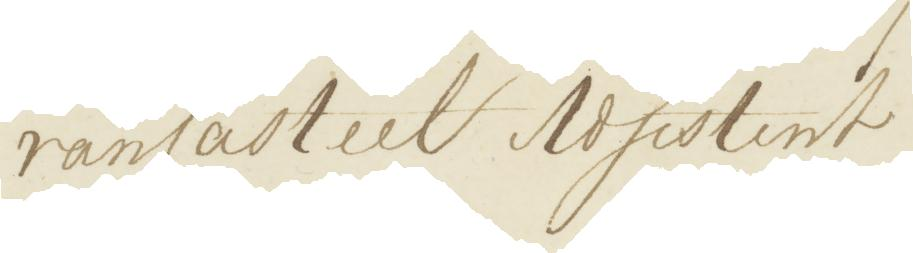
van Casteel Adsistent
